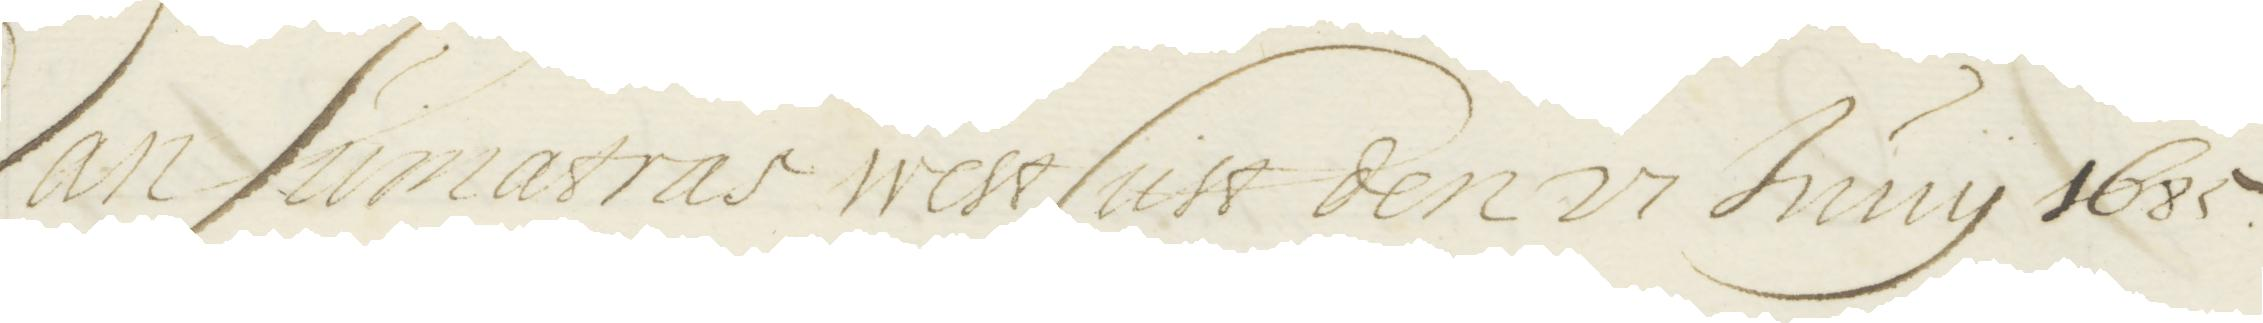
Van Sumatras west cust den 27 Junij 1685.
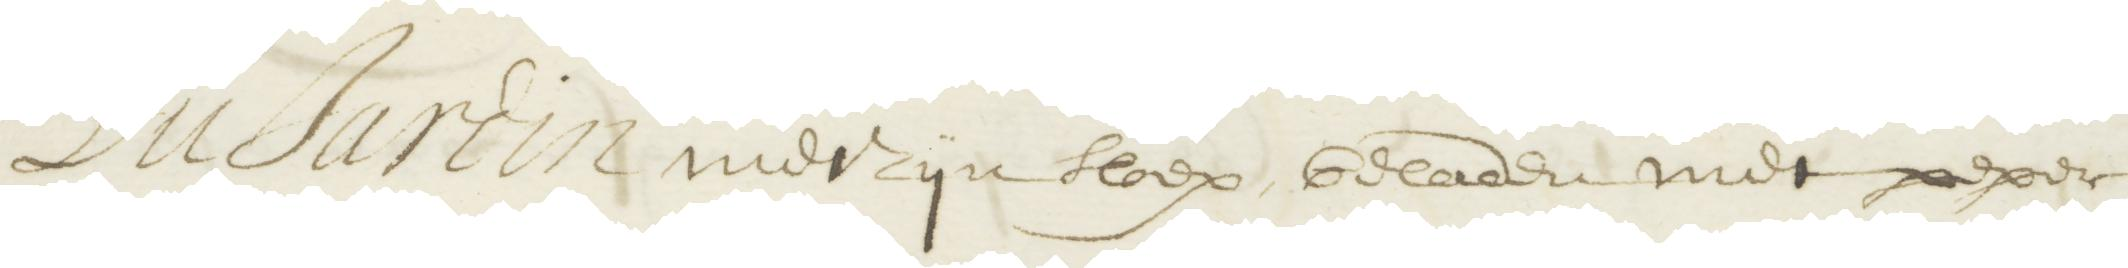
Du Jardin met zijn sloep, beladen met peper
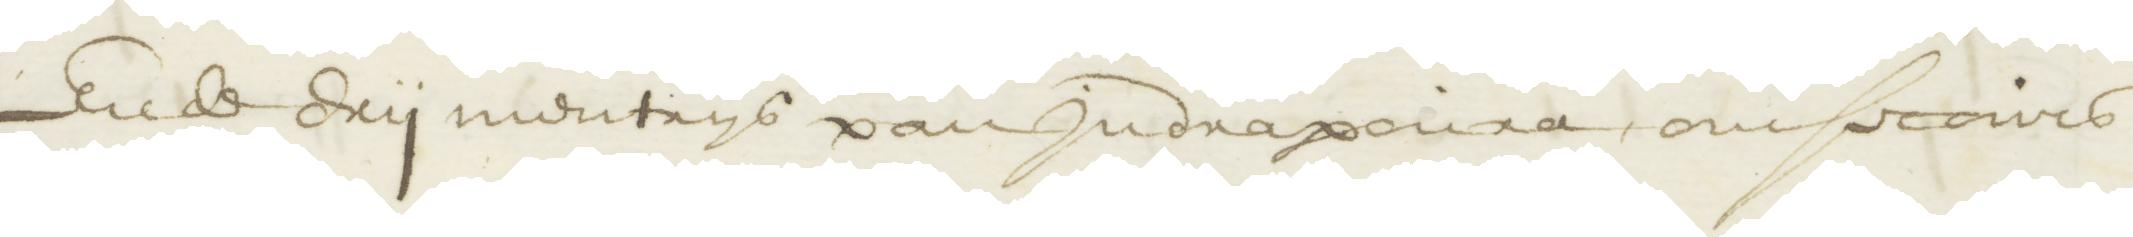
Ende drij mentrijs van jndrapoura, om secours
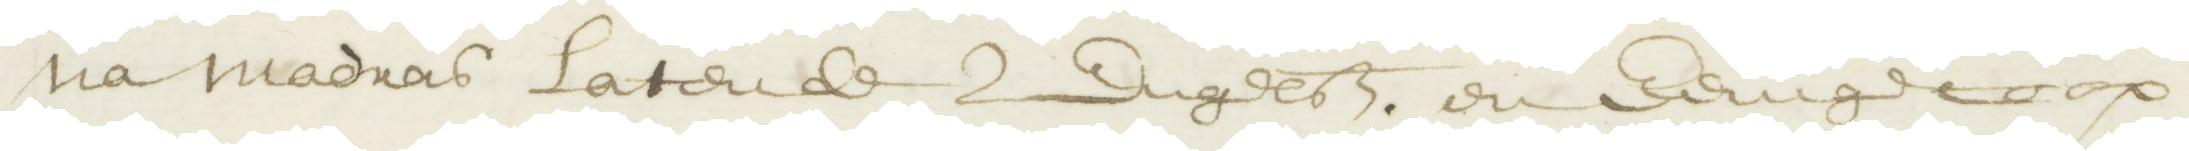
na madras latende 2 Engelsz. en Eenige coop
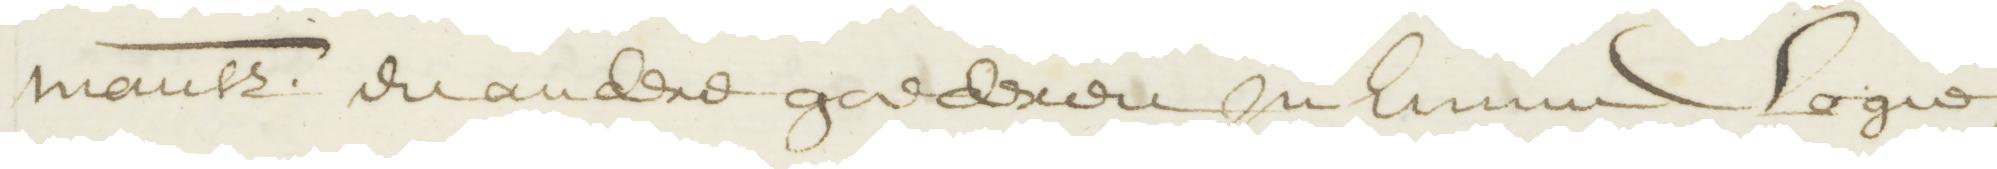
mansz. en andere goederen jn hunne Logie
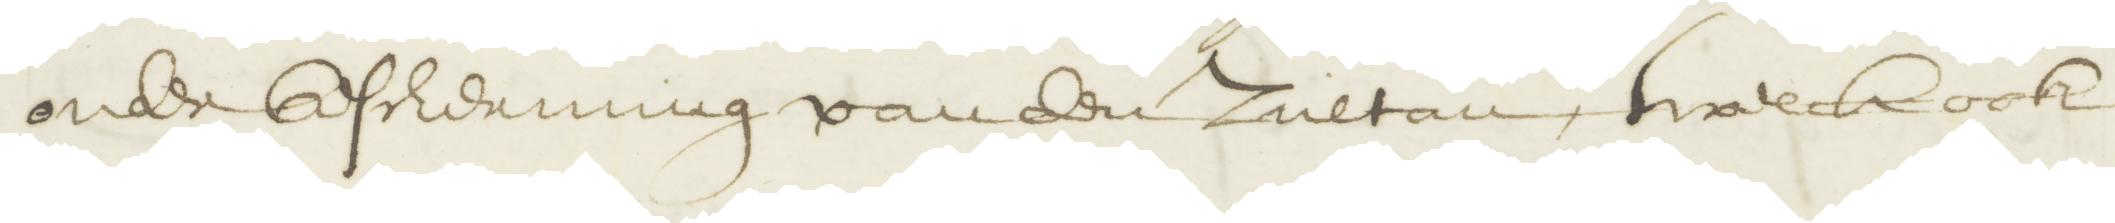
onder bescherming van den zultan, 'twelck ook
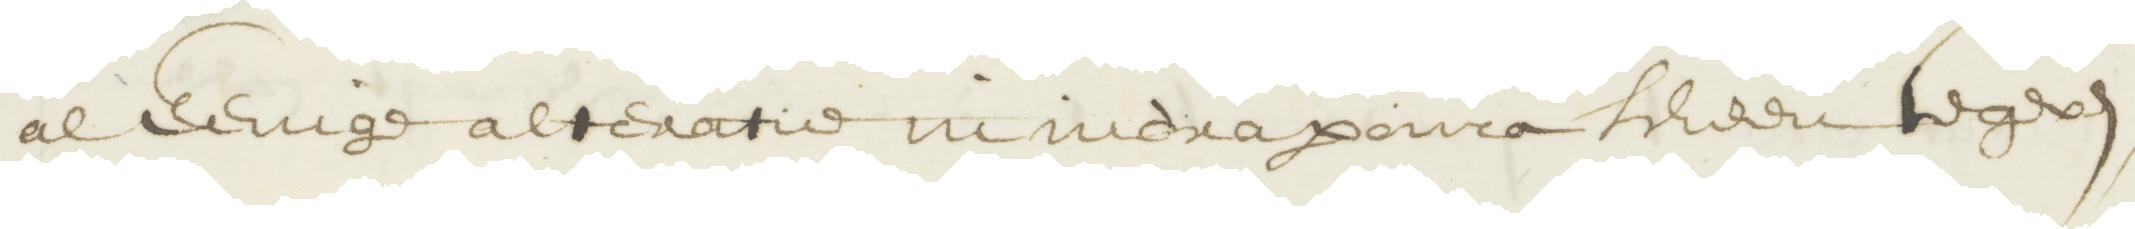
al Eenige alteratie in indrapoura scheen te geven,
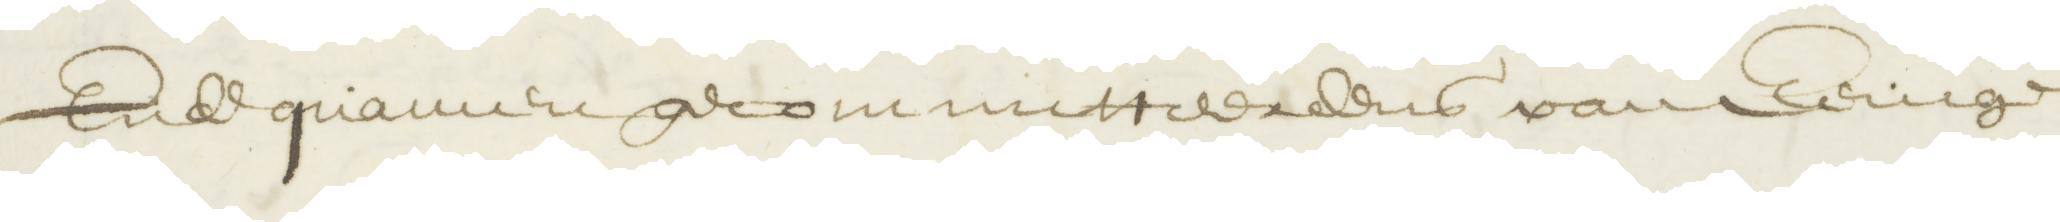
Ende quamen gecommitteerdens van Eenige
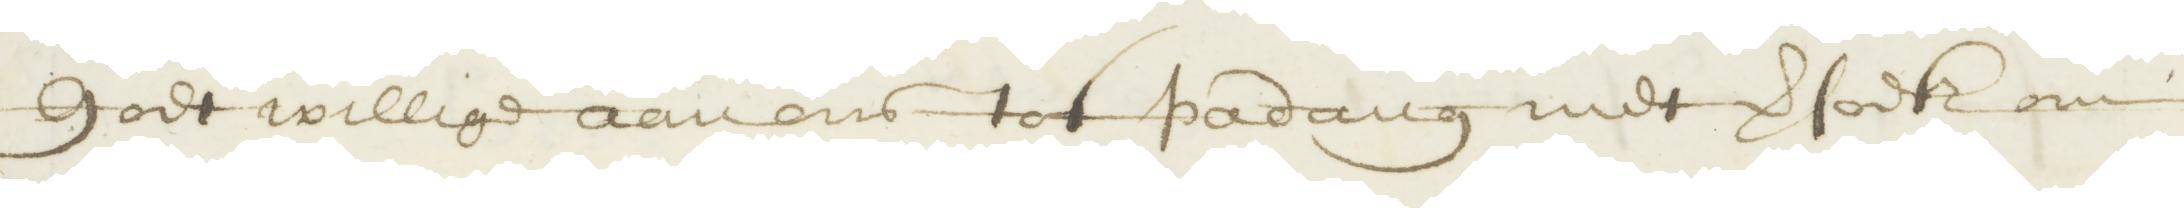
goetwillige aan ons tot padang met versoek om
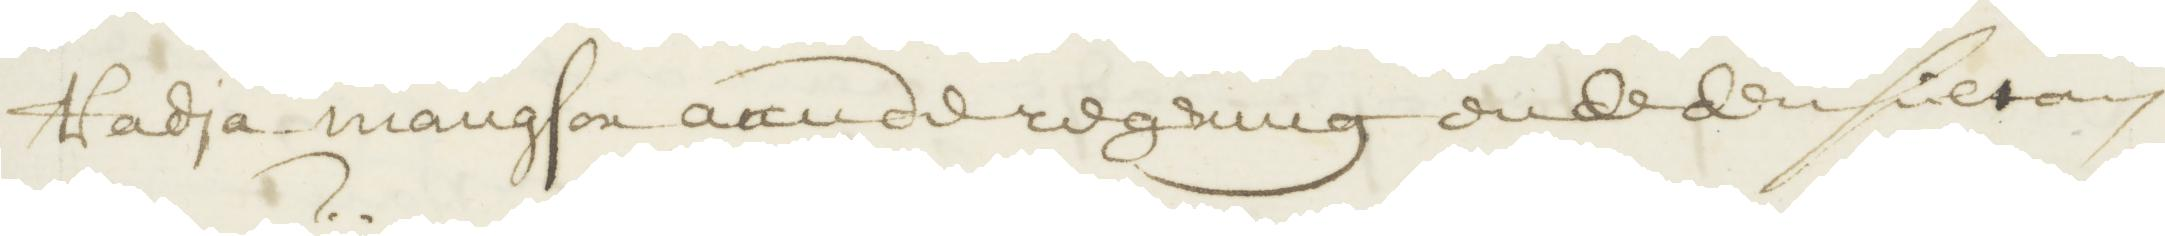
radja-mangsor aan de regering ende den sultan
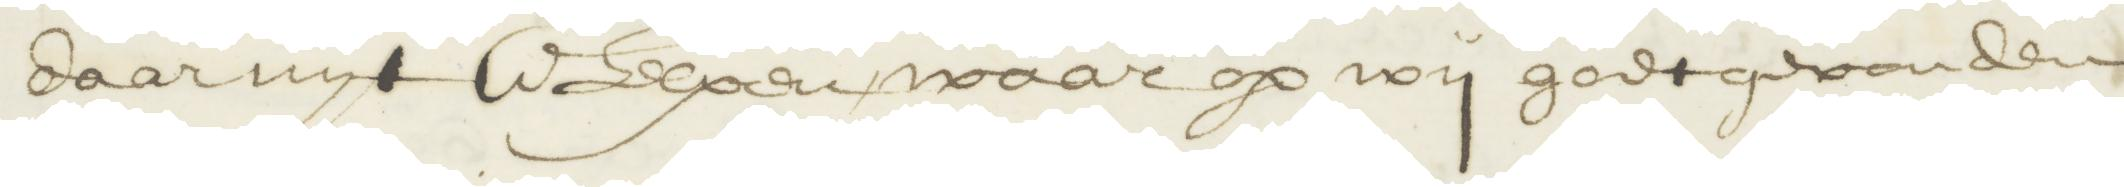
daaruijt te helpen, waar op wij goet gevonden
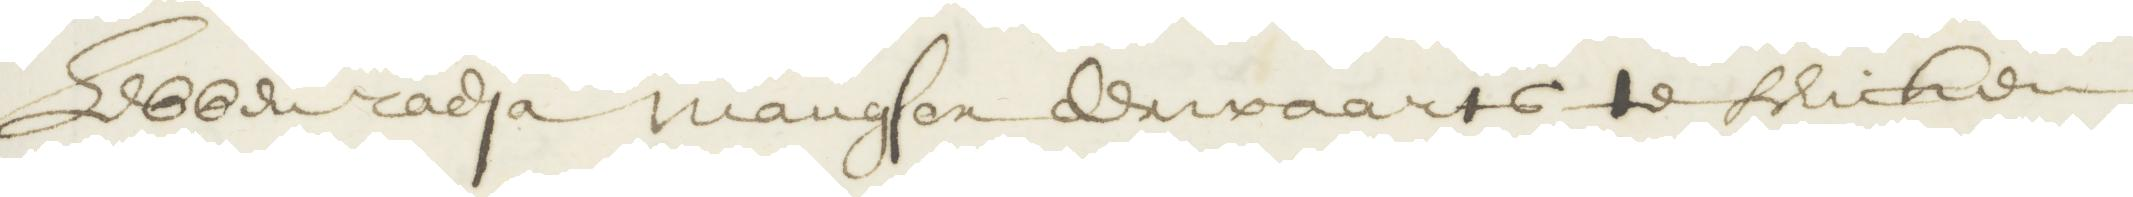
hebben radja mangsor derwaarts te schicken
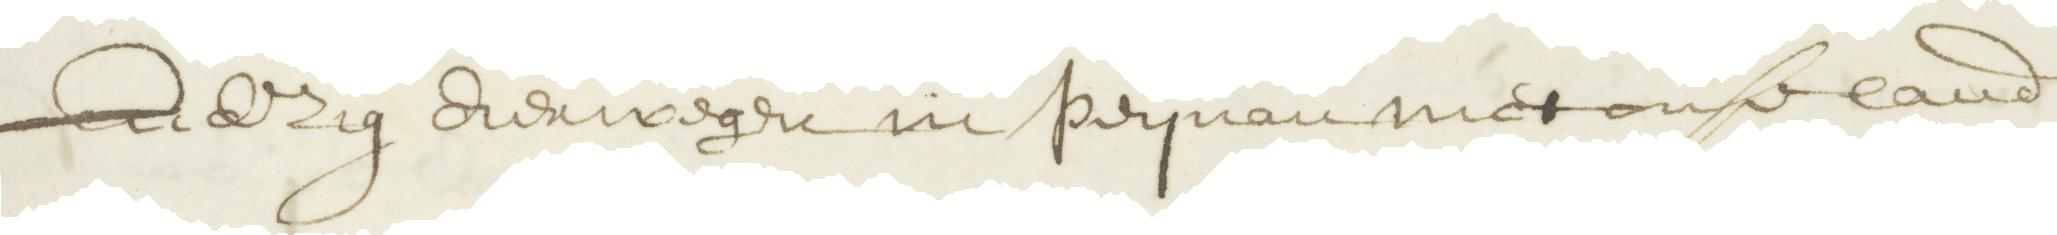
Ende zig dierwegen in peijnan met onse land
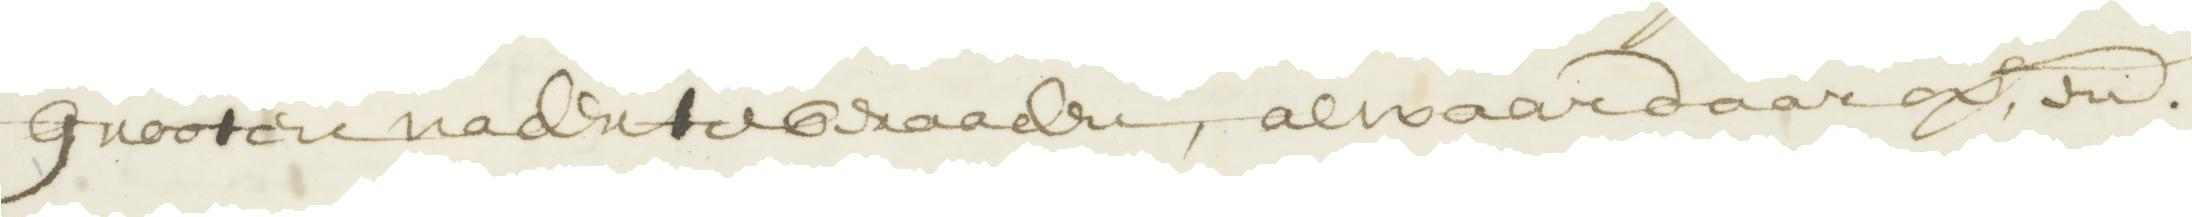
grooten nader te beraaden, alwaar daar over, en.
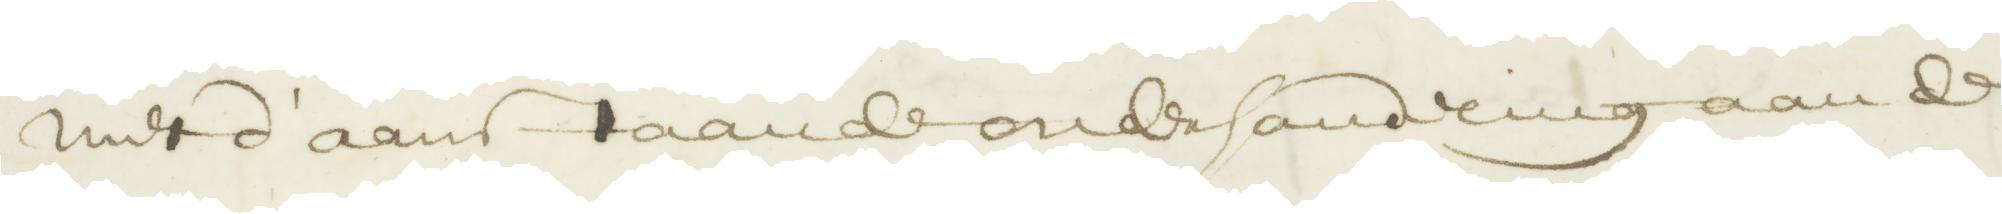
met d’aanstaande onderhandeling aan de
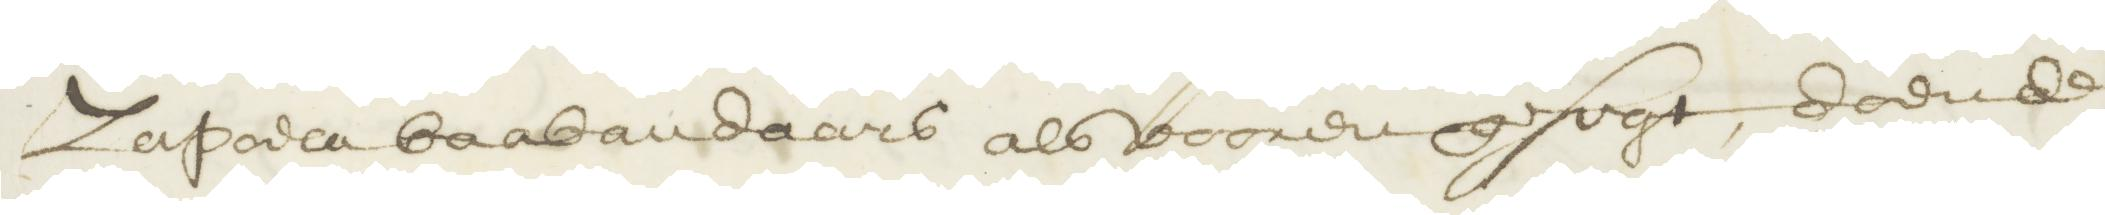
Zapoela boabandaars als vooren gesegt, doende
